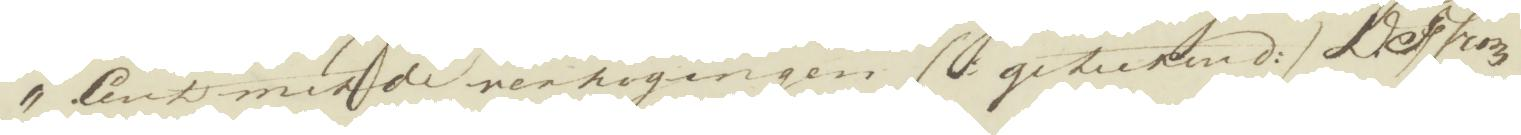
„ .Cent met de verhogingen /: geteekend:/ D.F Crom
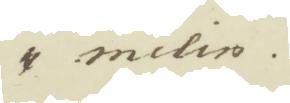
„ .melin.
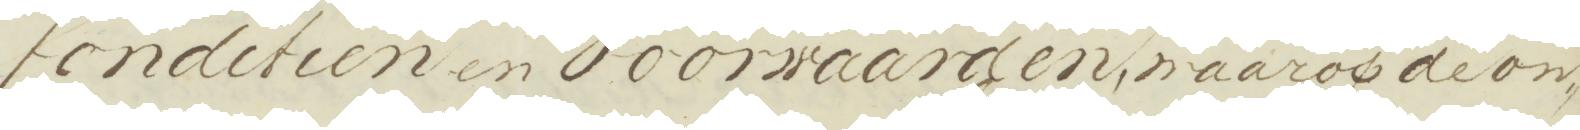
Conditien en voorwaarden, waarop de on„
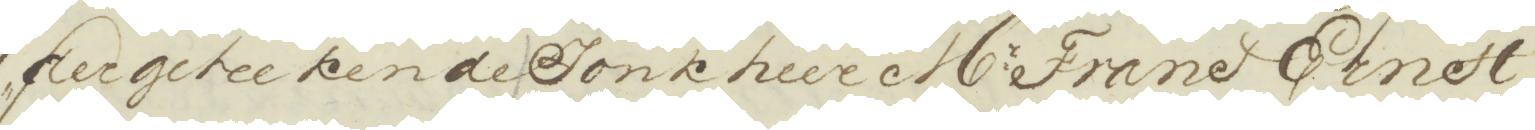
„dergeteekende Jonk heer M:r Frans Ernst
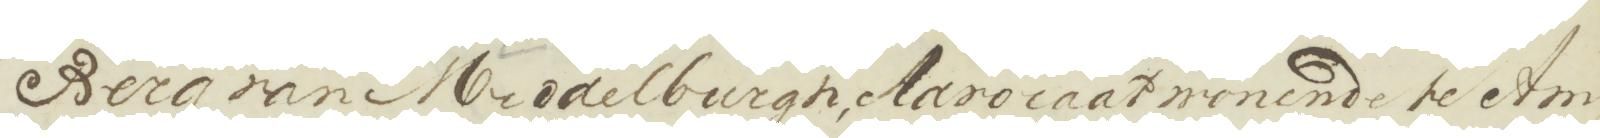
Berg van Middelburgh, Advocaat wonende te Am
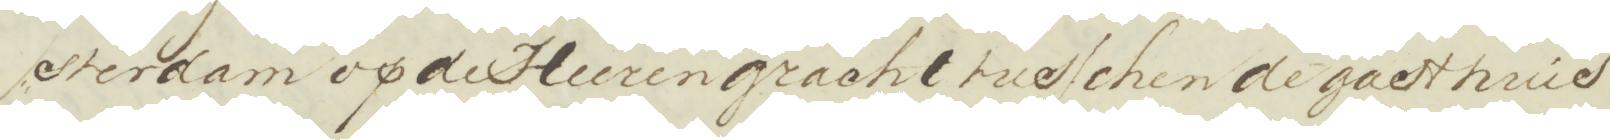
„sterdam op de Heerengracht tusschen de gasthuis
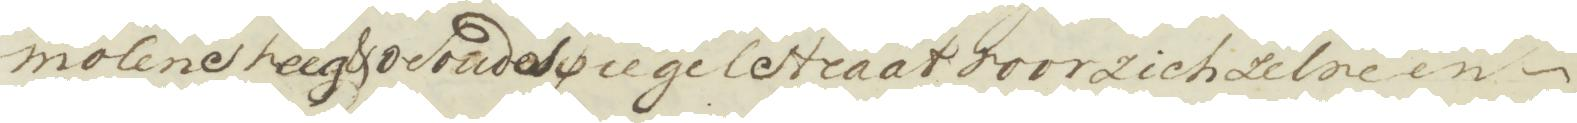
molensteeg & de oudespiegelstraat voor zich zelve en
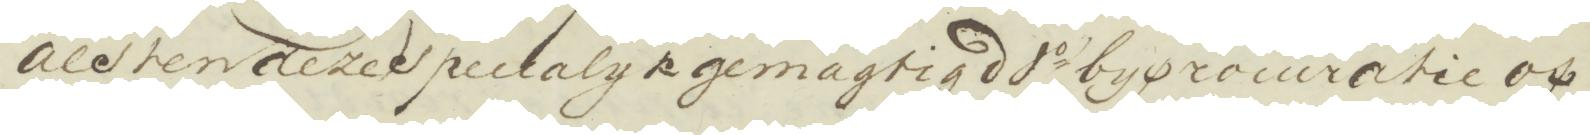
als ten deze specialyk gemagtigd 1=o by procuratie op
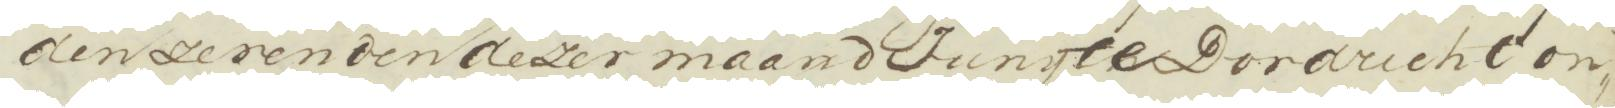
den zevenden dezer maand Juny te Dordrecht on„
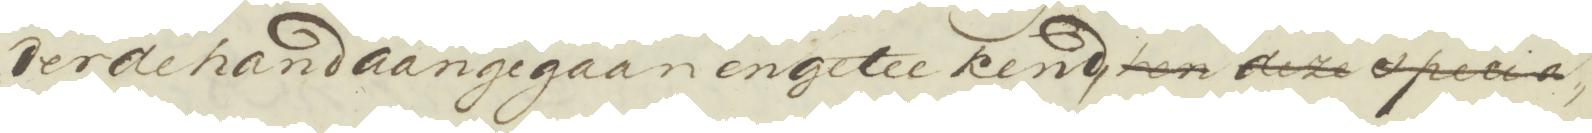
„der de hand aangegaan en geteekend, ten deze spelia„
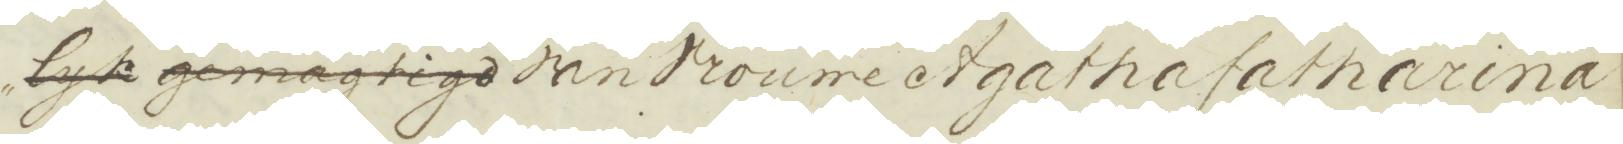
„lyk gemagtigd van vrouwe Agatha Catharina
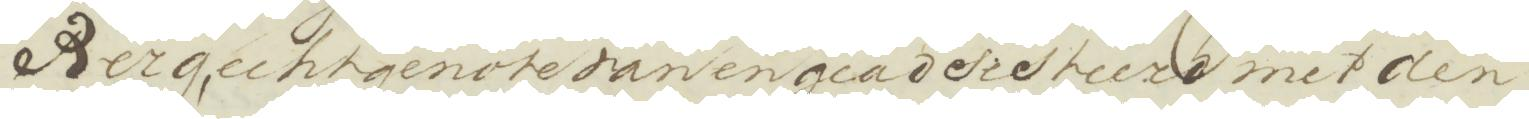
Berg, echtgenote van en geadsisteerd met den
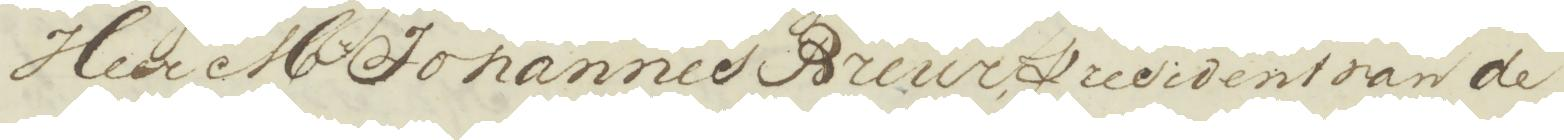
Heer M.r Johannes Breur, President van de
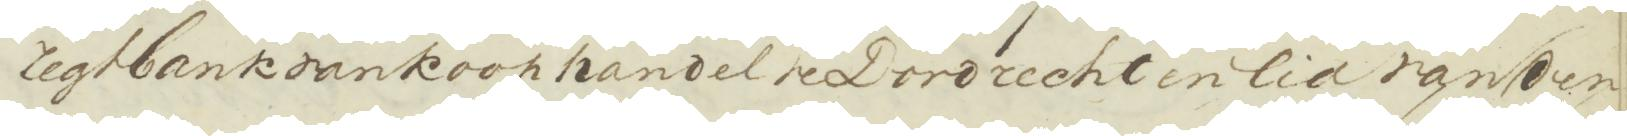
regtbank van koophandel te Dordrecht en lid van den
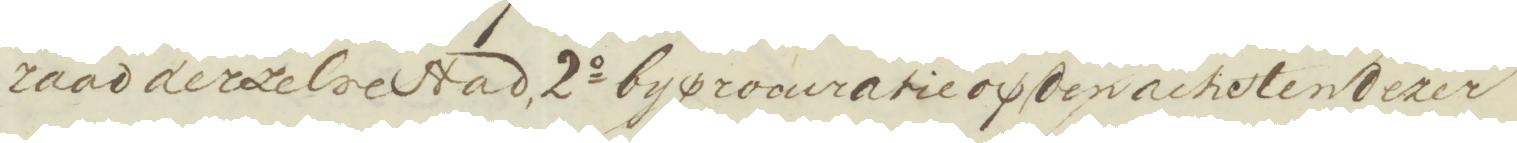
raad derzelve stad, 2=o by procuratie op den achsten dezer
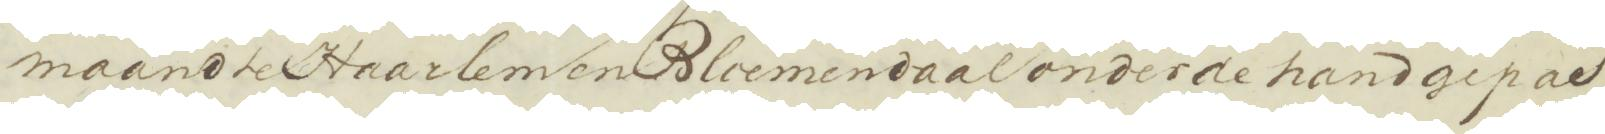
maand te Haarlem en Bloemendaal onder de hand gepas
